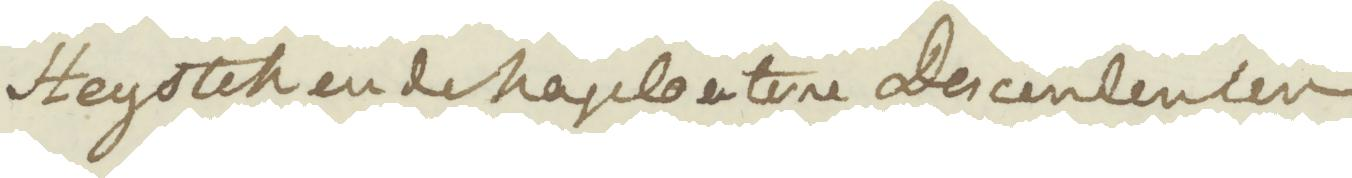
Heystek en de nagelatene Descendenten
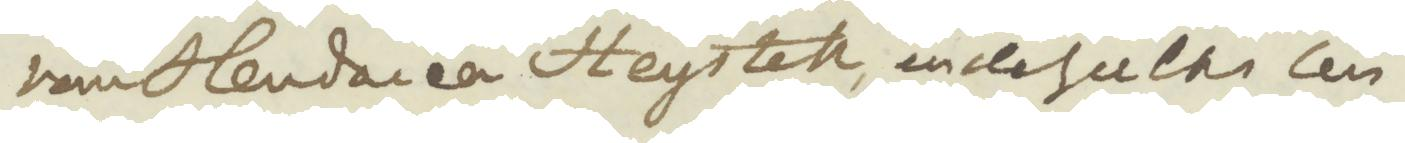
van Hendrica Heystek, en dezulks ten
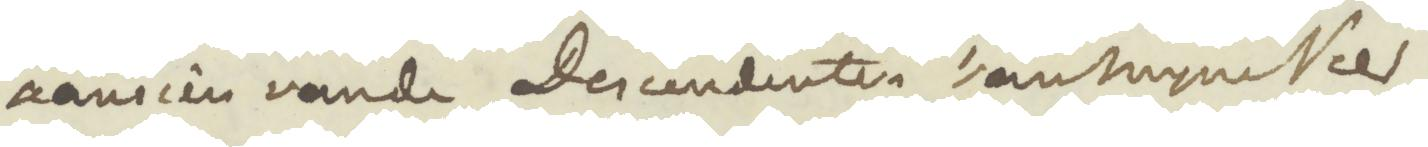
aansien van de Descendenten van myne Vier
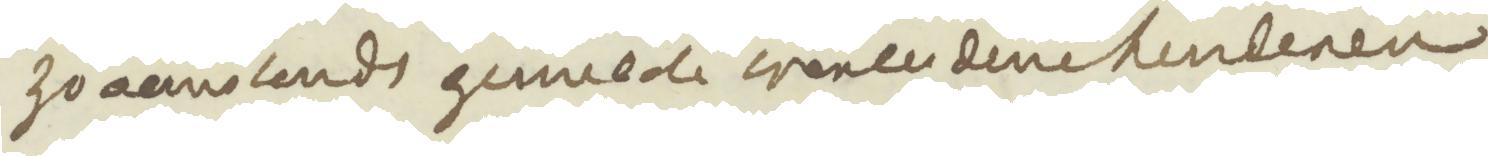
zo aanstonds gemelde overleedene kinderen
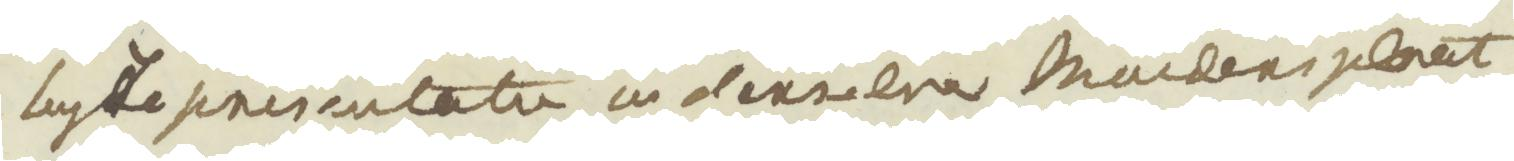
bij de presentatie, in derzelve Moeders plaat
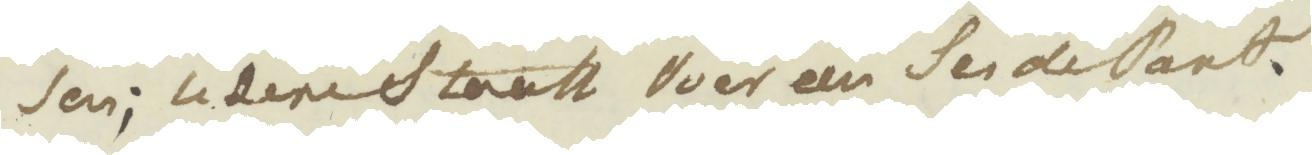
sen; in deze Staatt over een Sesde Part.
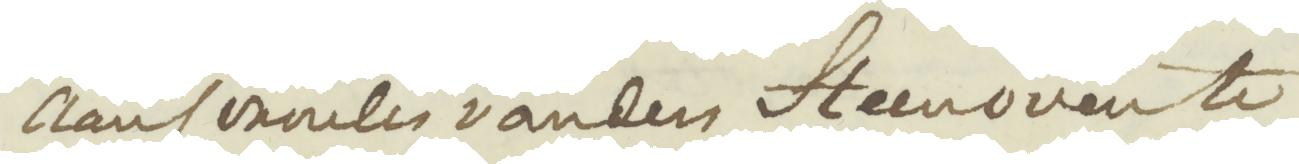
Aan Cornelis van den Steenoven te
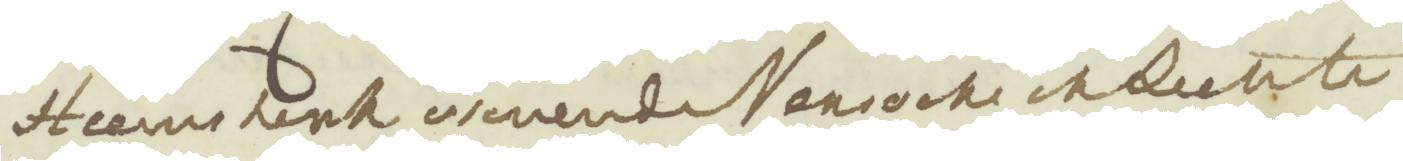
Heemskerk wonende Versoeke ik Zich te
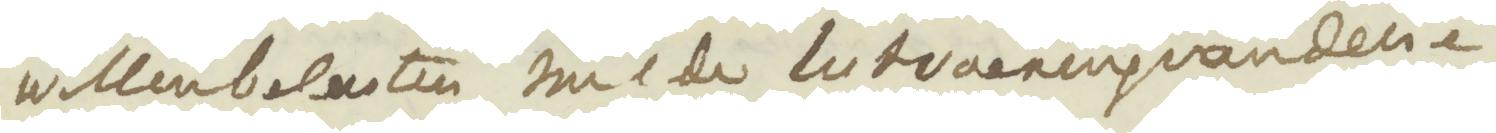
willen belasten met de uitvoering van deze
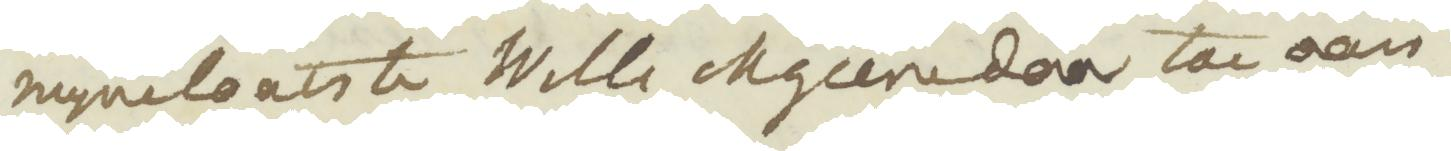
myne laatste Wille, ik geeve daer toe aan
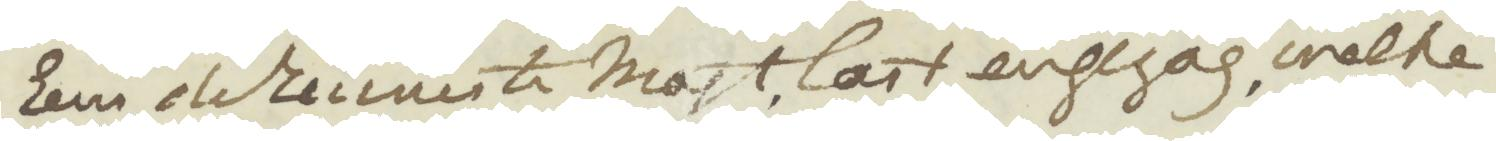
hem de ruimste magt, last en gezag, welke
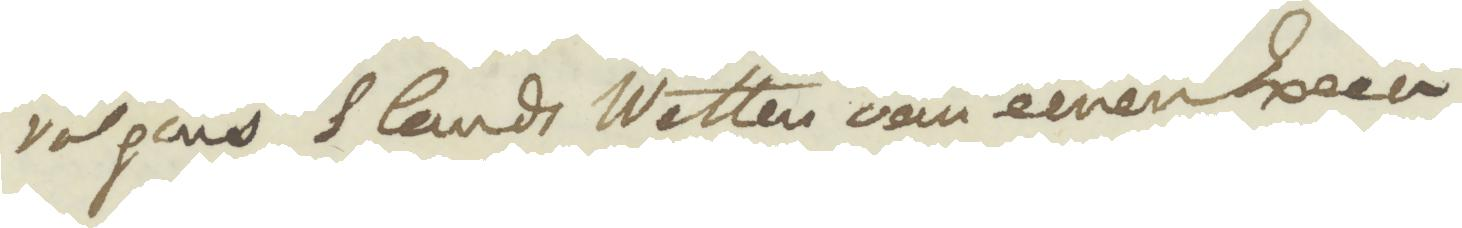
volgens 'S lands Wetten van eenen Execu
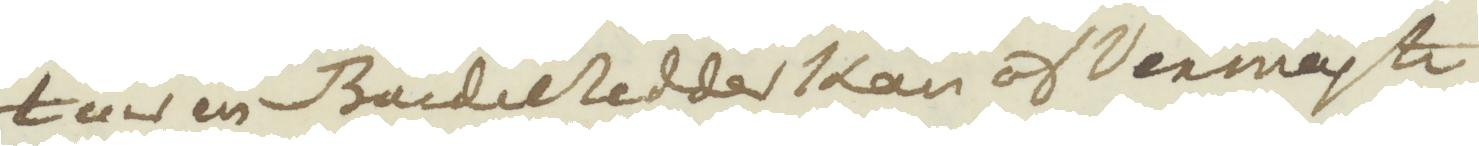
teur en Boedelredder kan of Vermag te
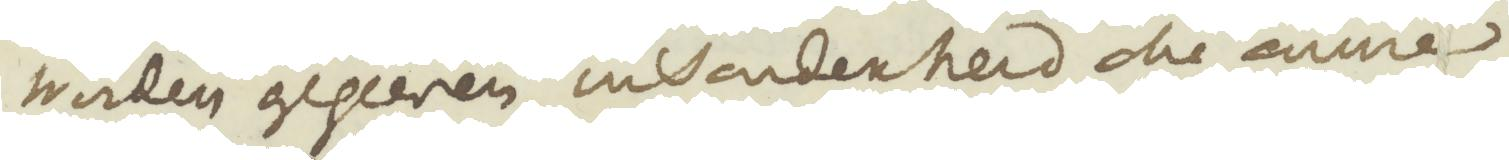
werden gegeeven insonderheid dit omme
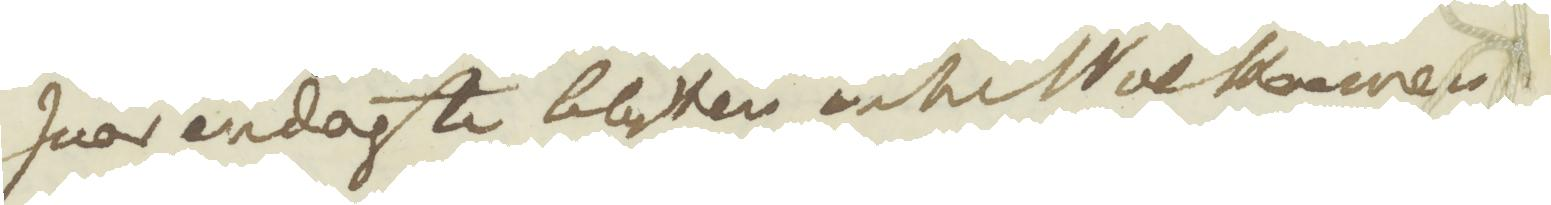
Jaar en dag te blyven in het Volkoomen
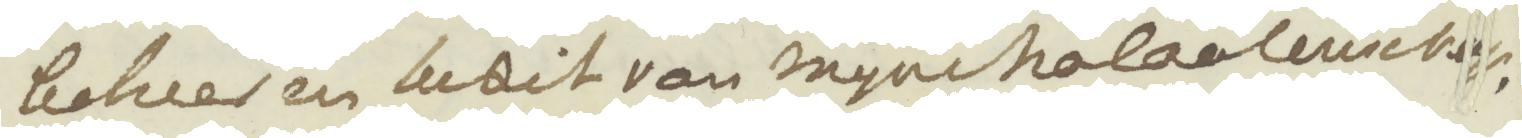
beheer en bezit van myne nalatenschap,
